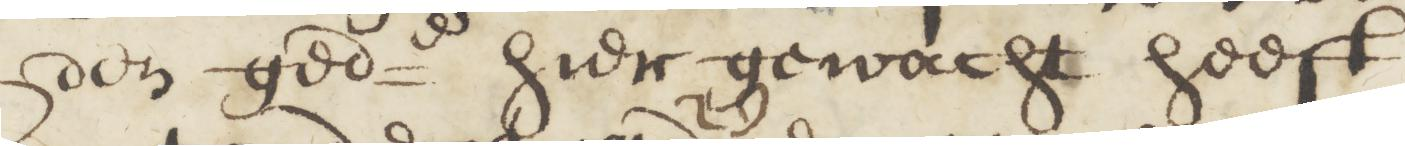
den ged=e hier gewacht heeft
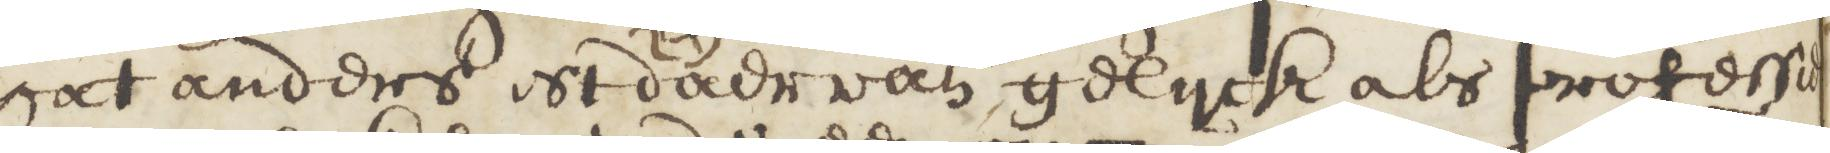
Wat anders ist daer van, gelijck als professie
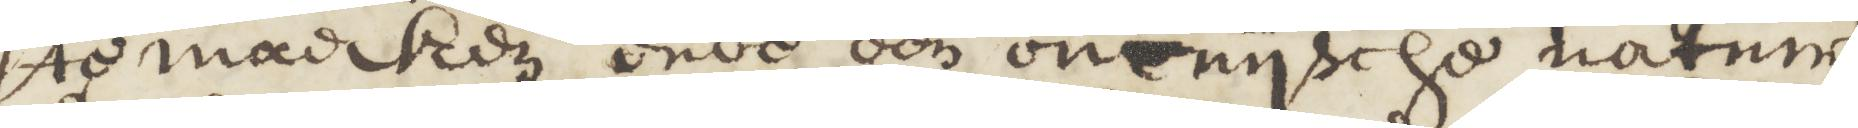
te maecken ende den oncuijsche natuir
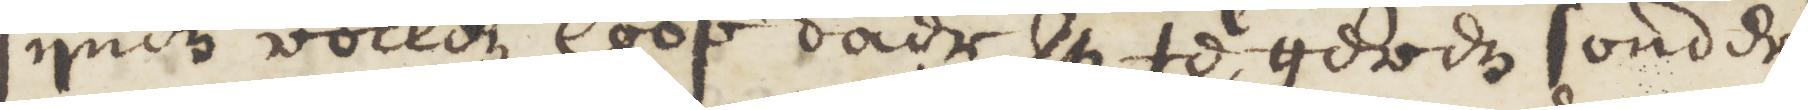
sijnen vollen loop daer Jn te geven sonder
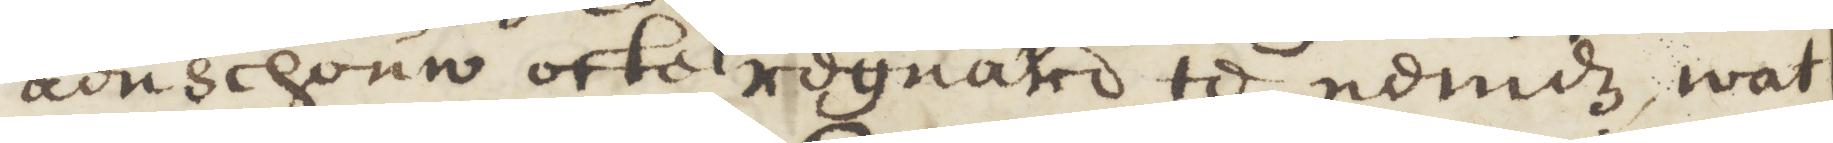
aenschouw ofte reguard te nemen wat
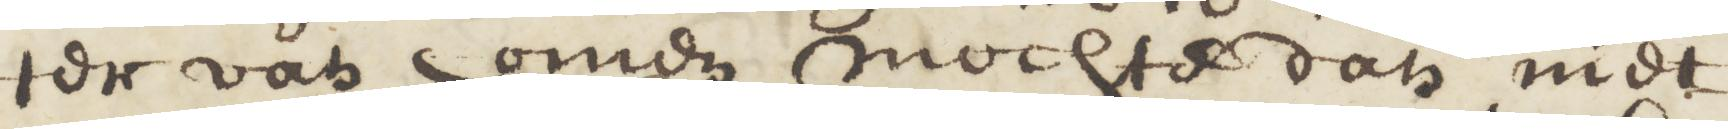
ter van comen mochte dan niet
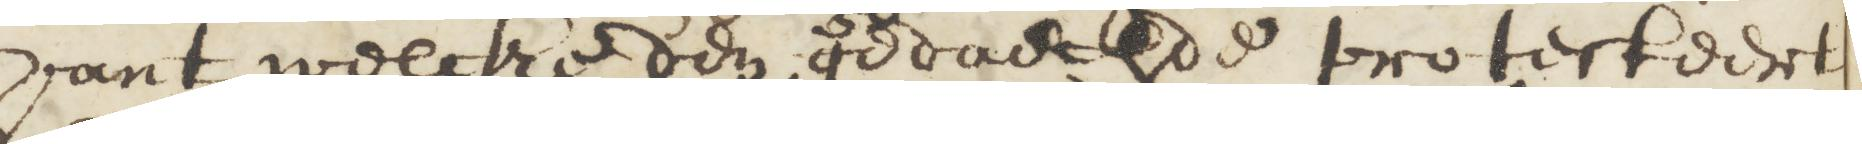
vant welcke den gedaechde protesteert
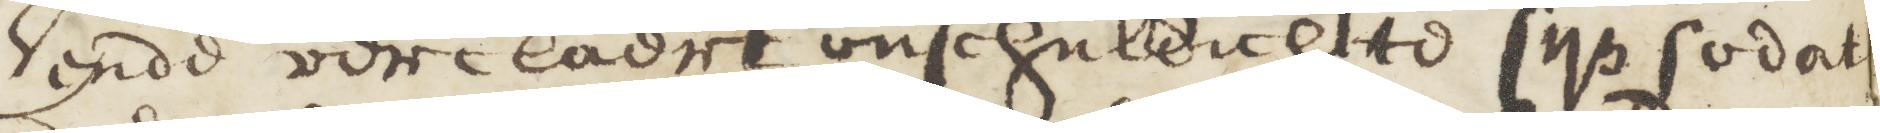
ende verclaert onschuldich te sijn sodat
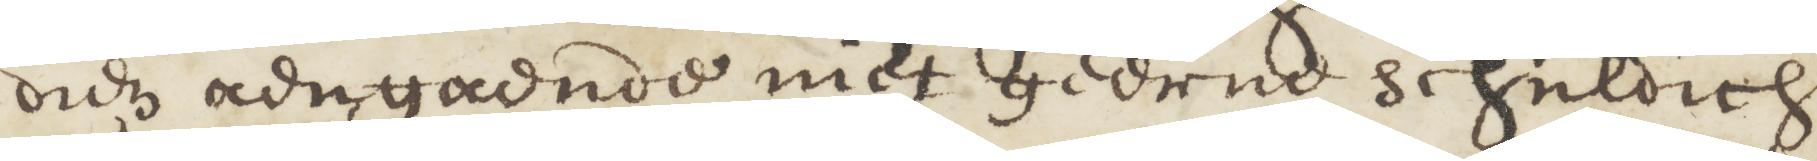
dien aengaende niet geerne schuldich
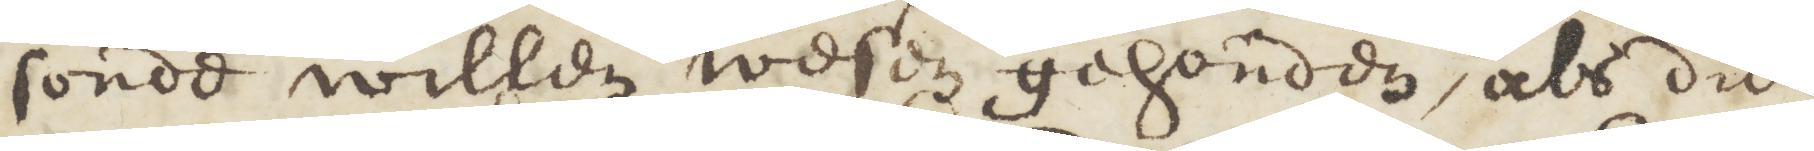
soude willen wesen gehouden, als die
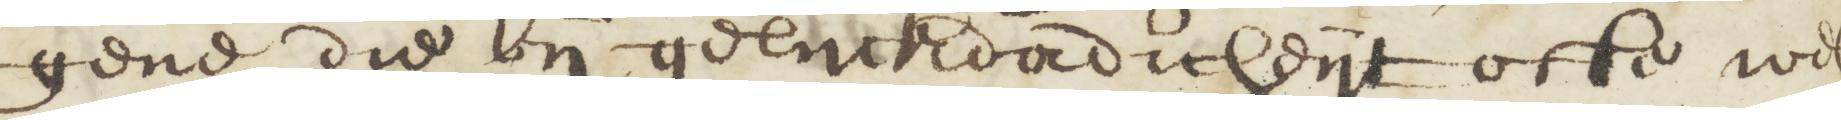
gene die bij geluckdadichejt ofte we
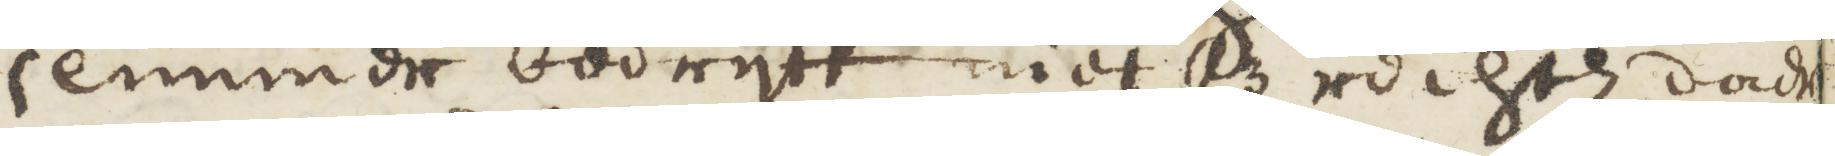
slimmer bedrijff niet Jn rechten daer
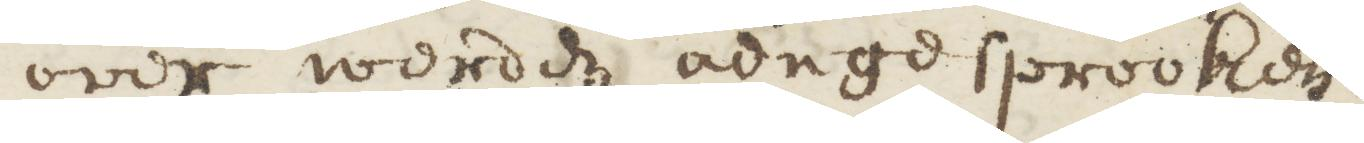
over werden aengesprooken
